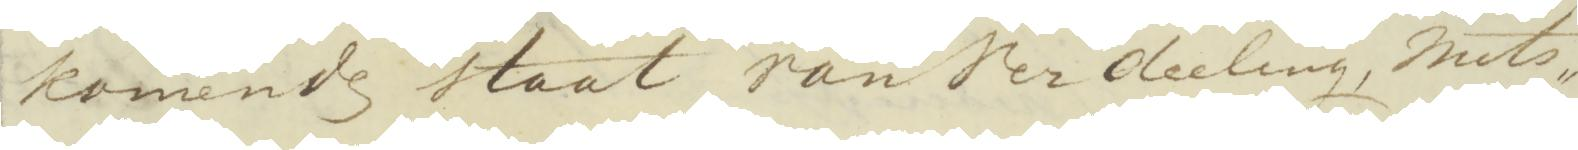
komende staat vanVerdeeling, mits„
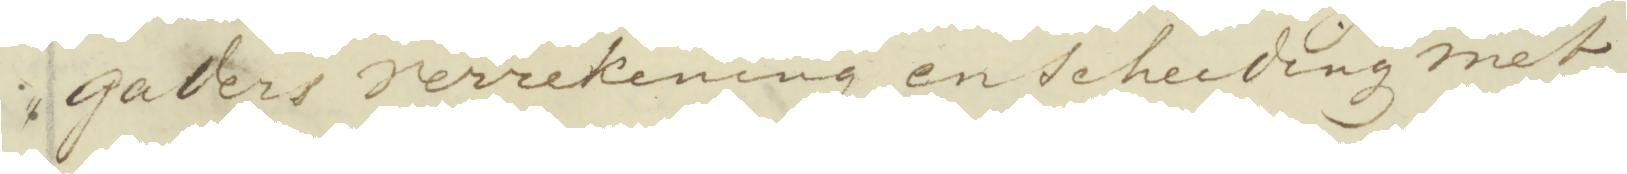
„gaders verrekening en scheiding met
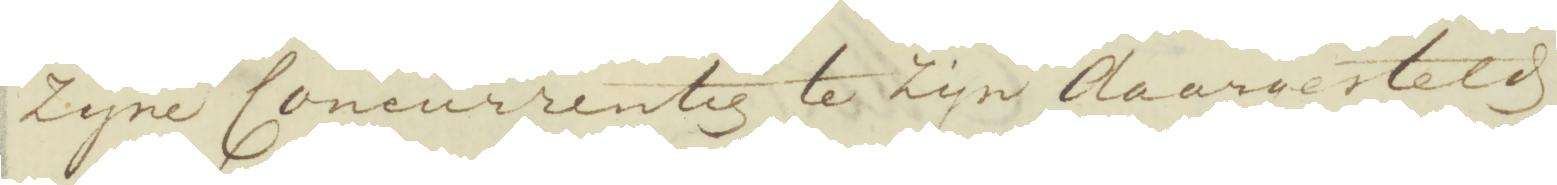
zijne Concurrentie te zijn daargesteld
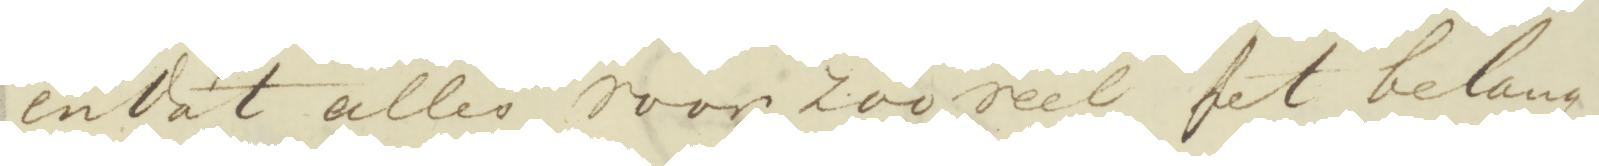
en dat alles voor zoo veel het belang
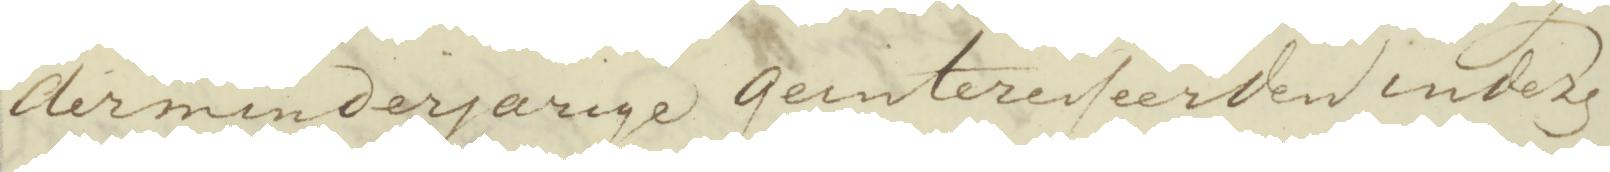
der minderjarige geinteresseerden indeze
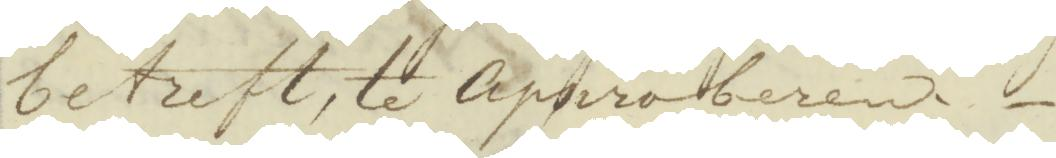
betreft, te approberen. —
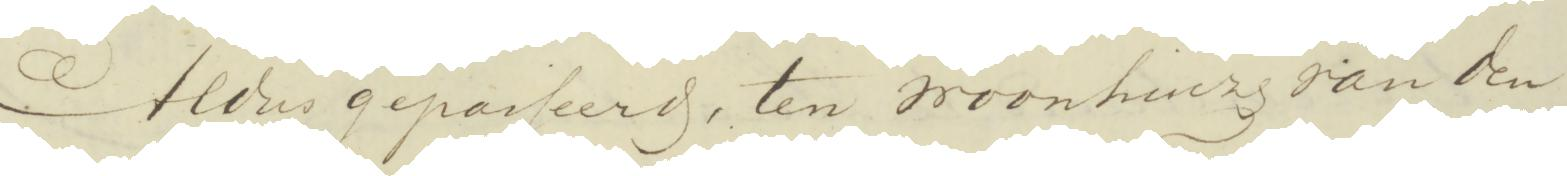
Aldus gepasseerd, ten woonhuize van den
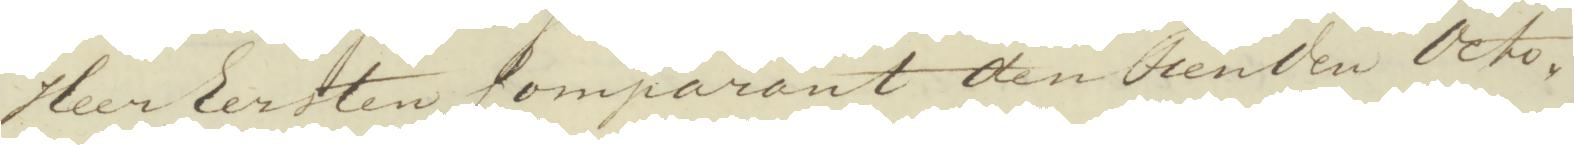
Heer Eersten Comparant den Tienden Octo„
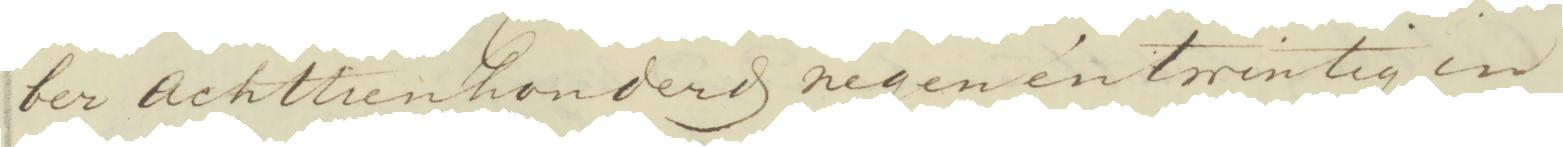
ber achttienhonderd negen entwintig in
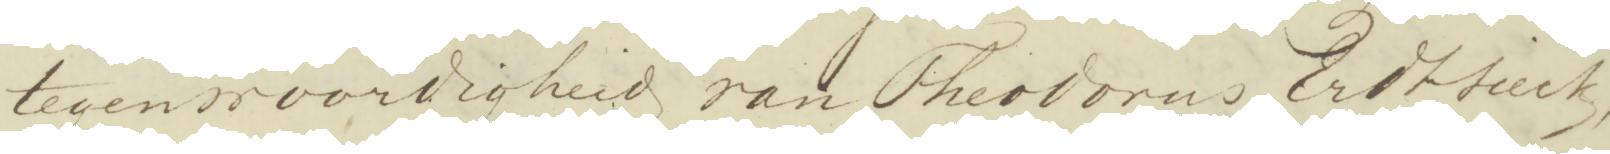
tegenwoordigheid van Theodorus Erdtsieck
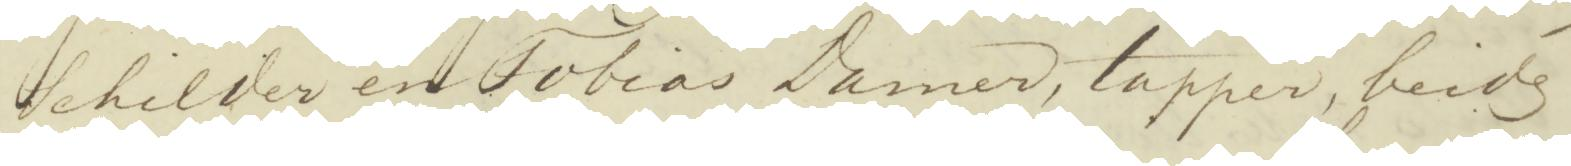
schilder en Tobias Damer, tapper, beide
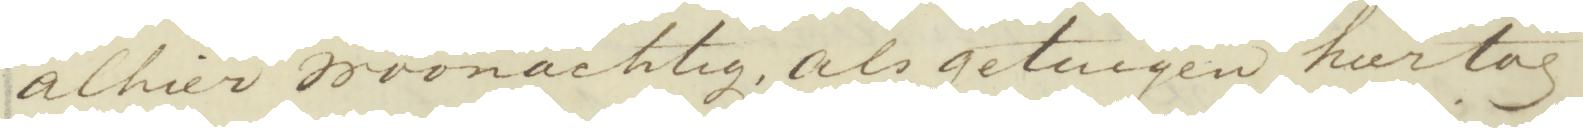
alhier woonachtig, als getuigen hiertoe
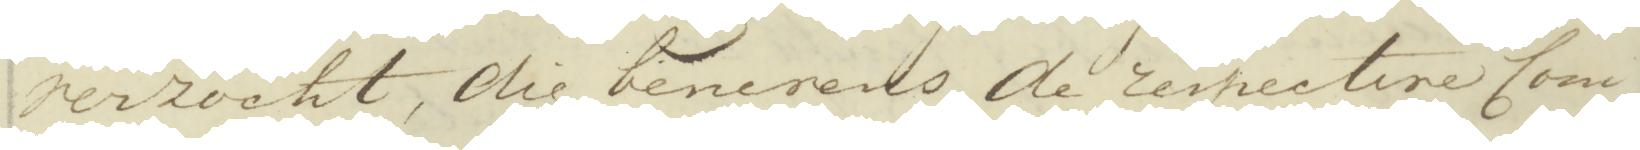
verzocht, die benevens de respective Com
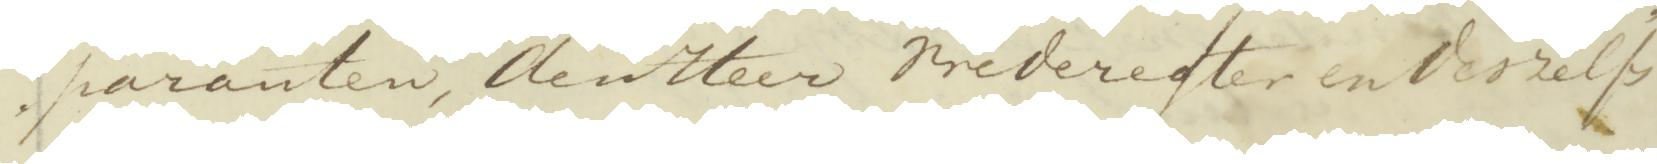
„paranten, den Heer Vrederegter en deszelfs
